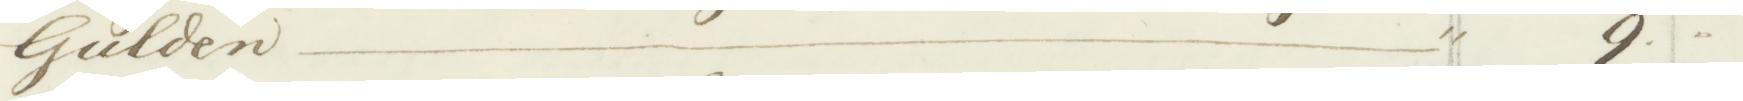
Gulden —„ 9. „
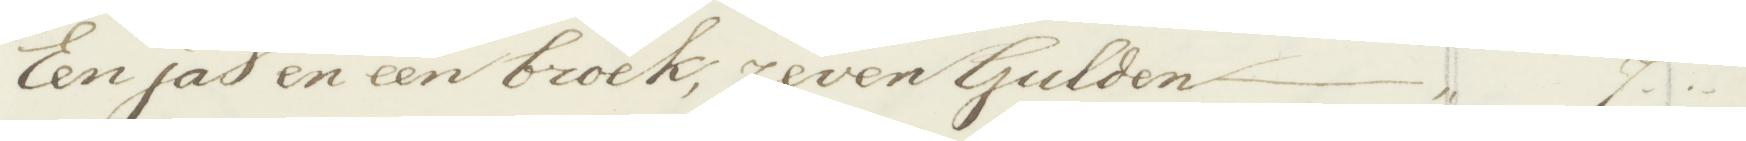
Een jas en een broek, zeven Gulden— „ 7.„
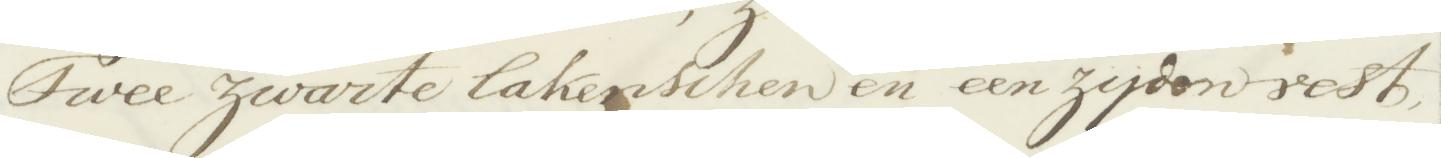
Twee zwarte lakenschen en een zijden vest,
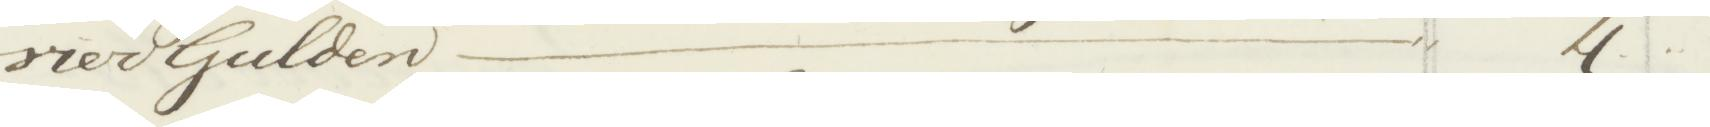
vier Gulden— „ 4.„
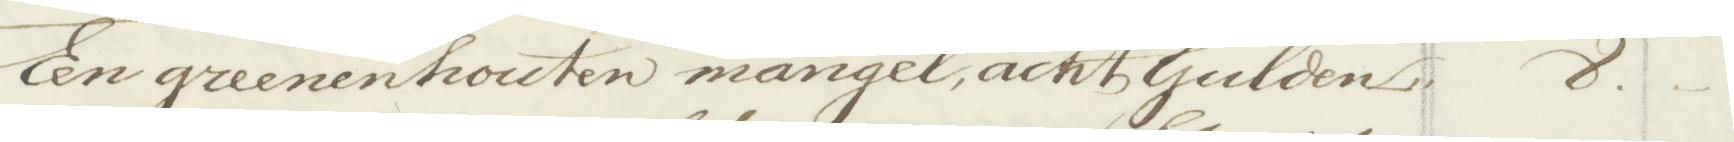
Een greenenhouten mangel, acht Gulden „ 8. „
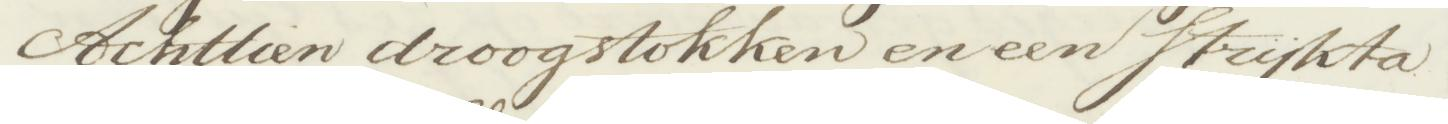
Achttien droogstokken en een strijkta
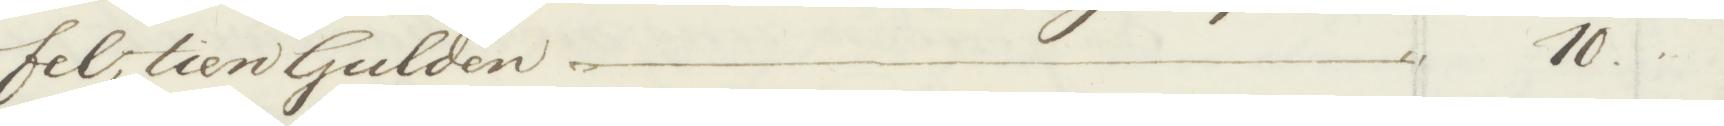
fel, tien Gulden —„ 10.„
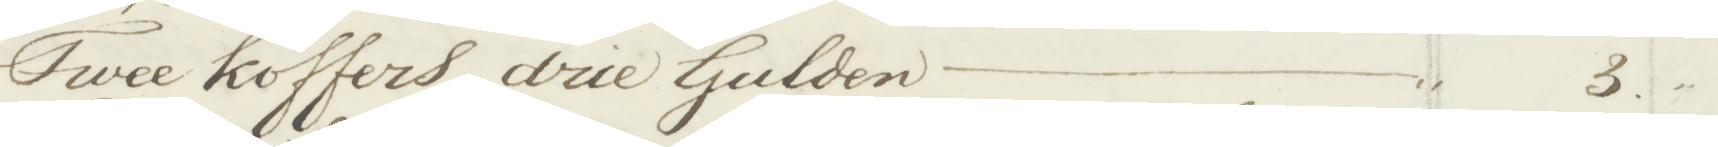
Twee koffers, drie Gulden—„ 3.„
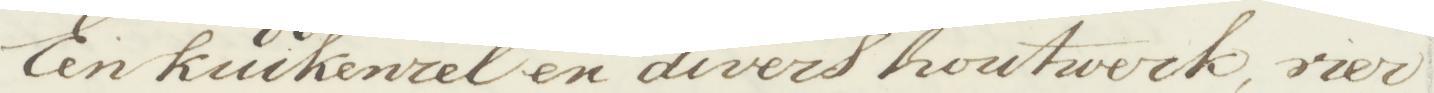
Een kuikenrel en divers houtwerk, vier
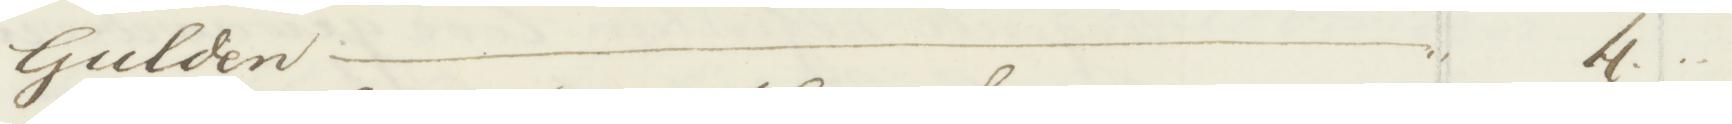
Gulden —„ 4.„
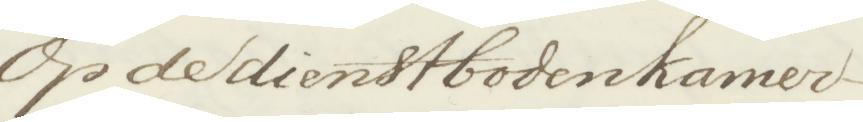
Op de dienstbodenkamer
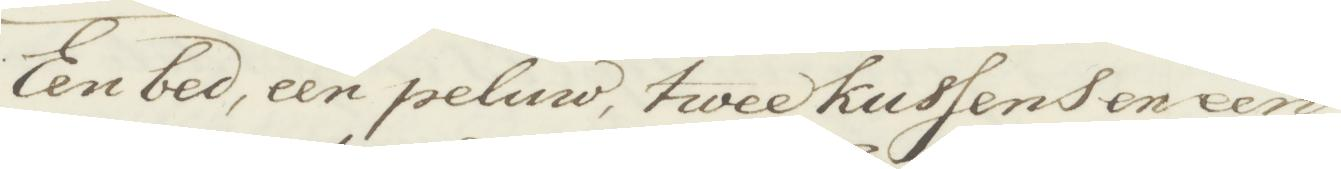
Een bed, een peluw, twee kussens en een
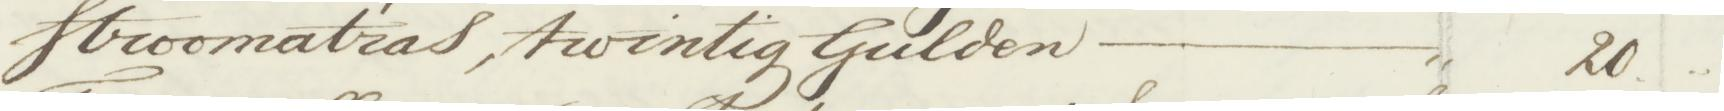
Stroomatras, twintig Gulden—„ 20.„
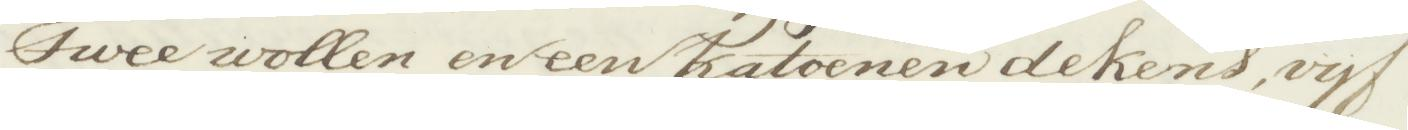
Twee wollen en een katoenen dekens, vijf
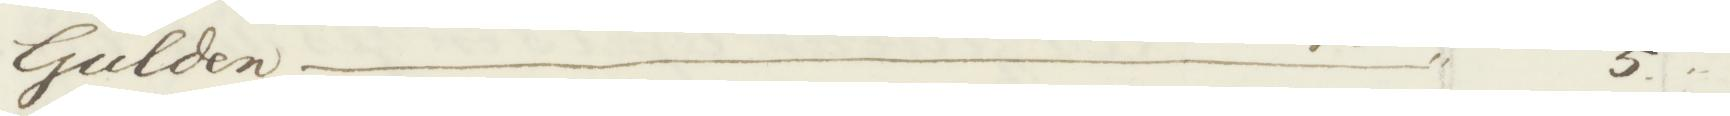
Gulden—„ 5.„
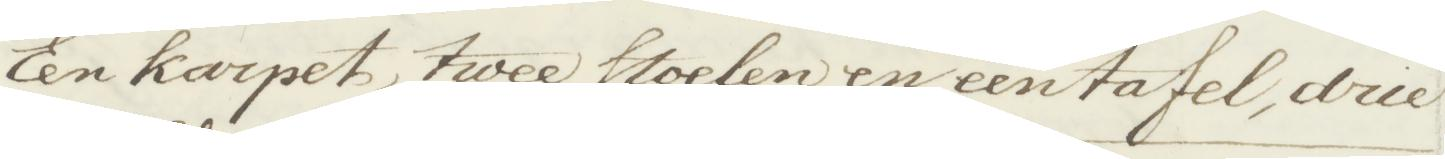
Een karpet, twee stoelen en een tafel, drie
